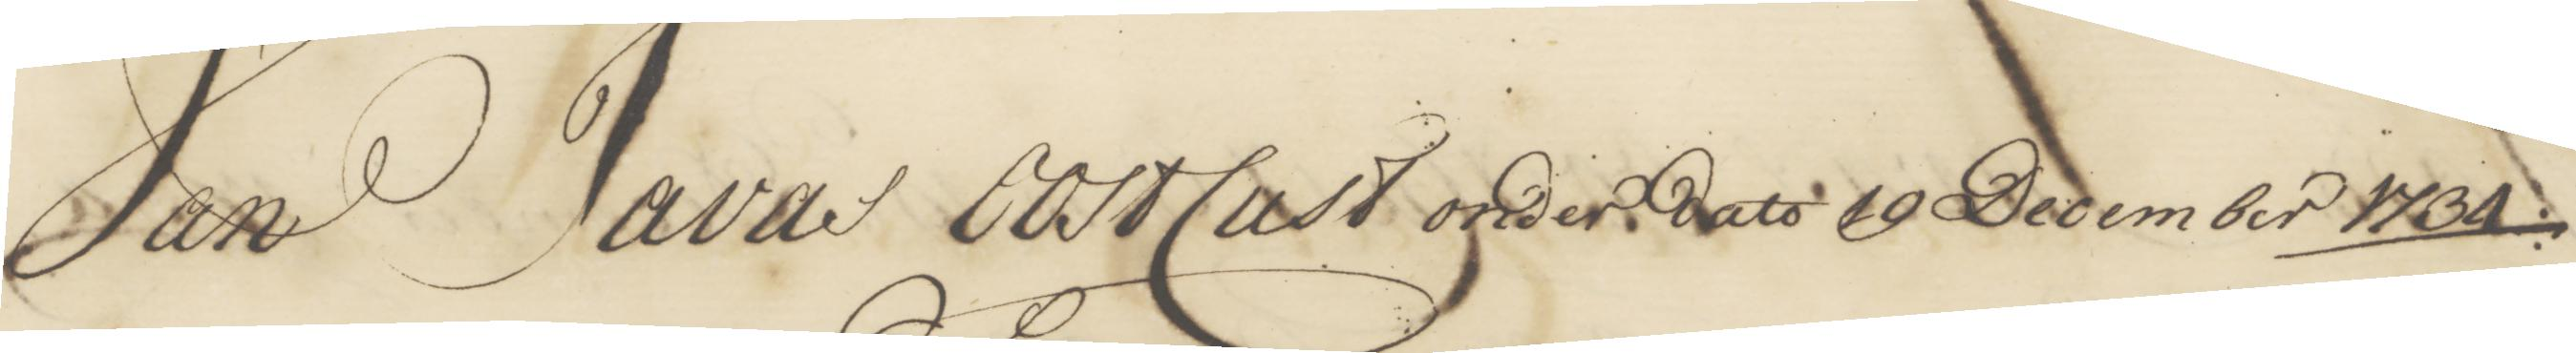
Van Javas OostCust onder dato 19 December 1734:
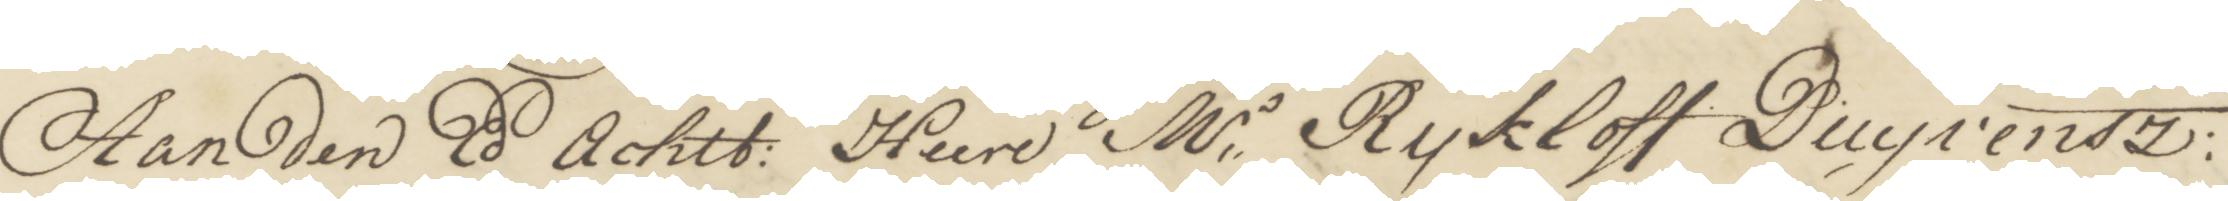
Aan den Ed Achtb: Heere M„r Rijkloff Duijvensz:
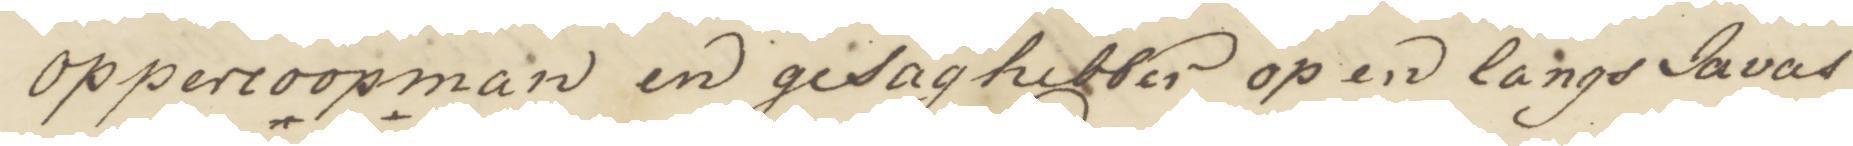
oppercoopman en gesaghebber op en langs Iavas
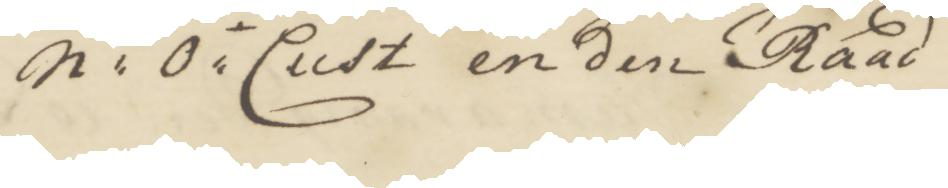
N„rt O„t Cust en den Raad
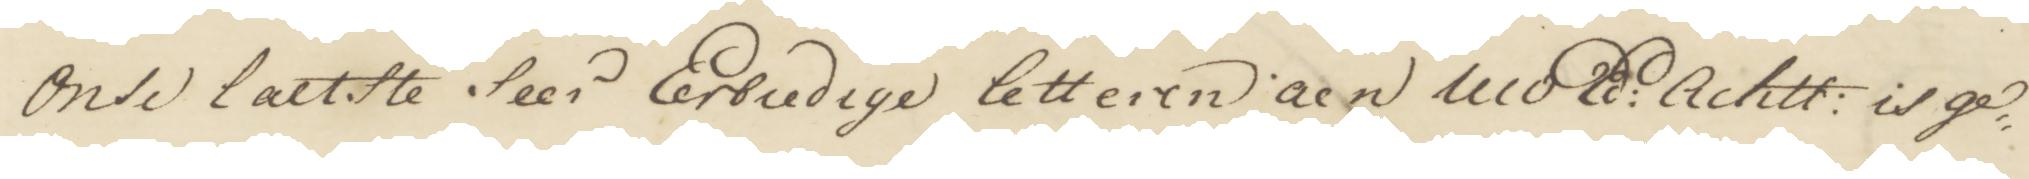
Onse laetste seer Eerbiedige letteren aen uw Ed: Achtb: is ge„
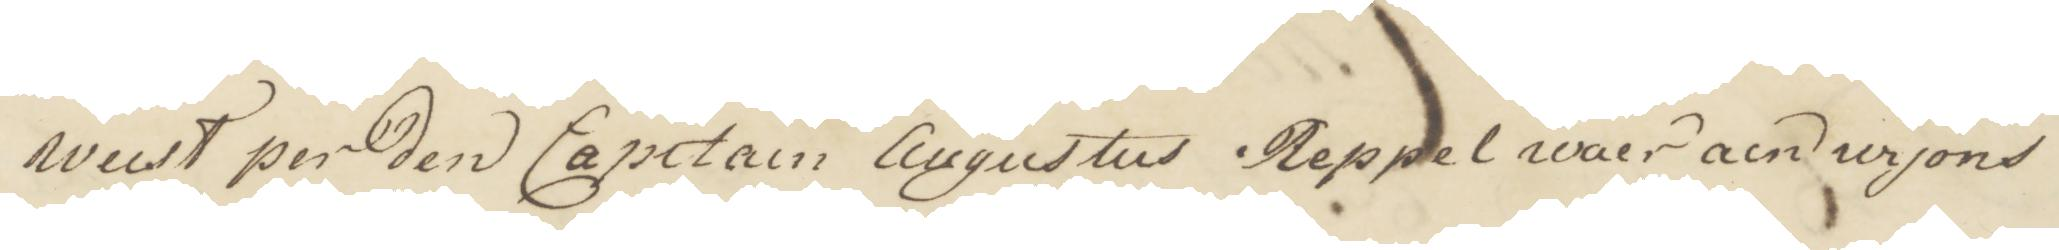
weest per den Capitain Augustus Reppel waer aen wy ons
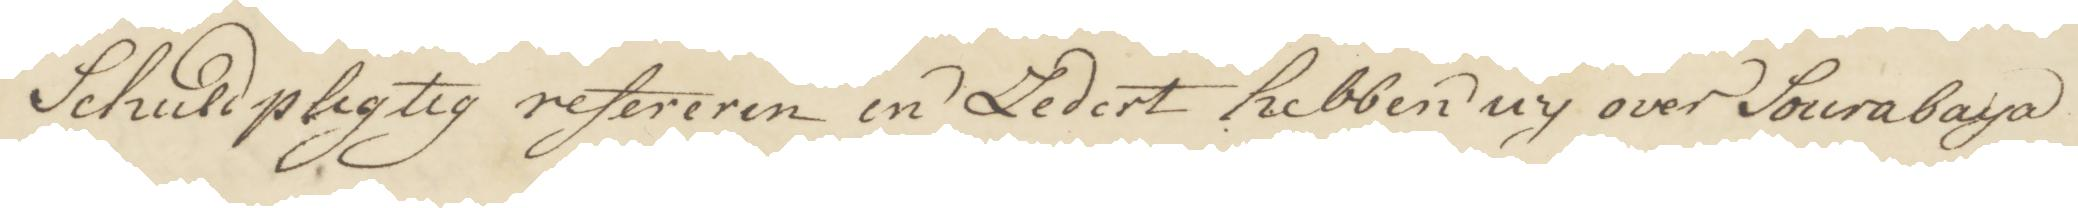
schuldpligtig refereren en zedert hebben wij over sourabaya
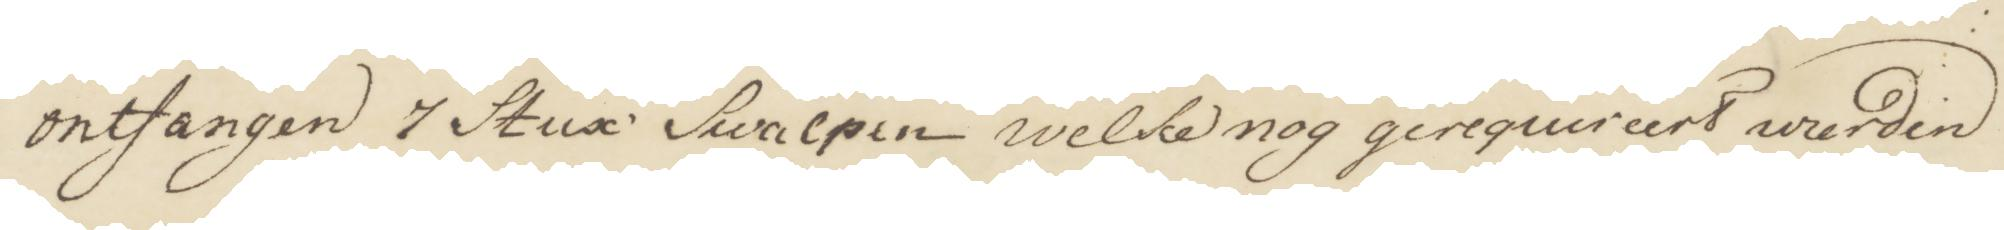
ontfangen 7 stux swalpen welke nog gerequireert wierden
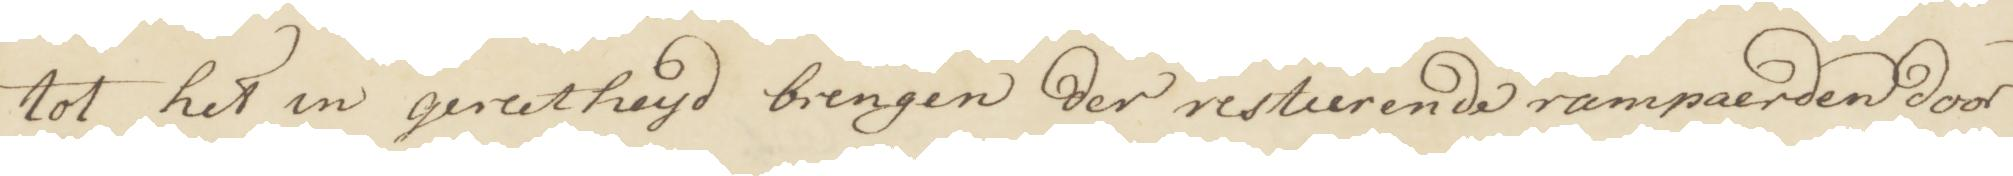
tot het in gereetheyd brengen der resteerende rampaerden door
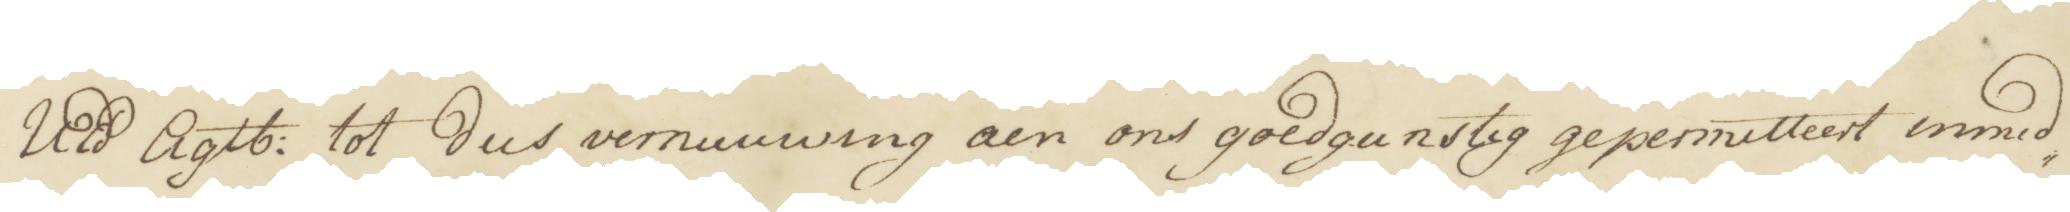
UEd Agtb: tot dus vernieuwing aen ons goedgunstig gepermitteert inmid„
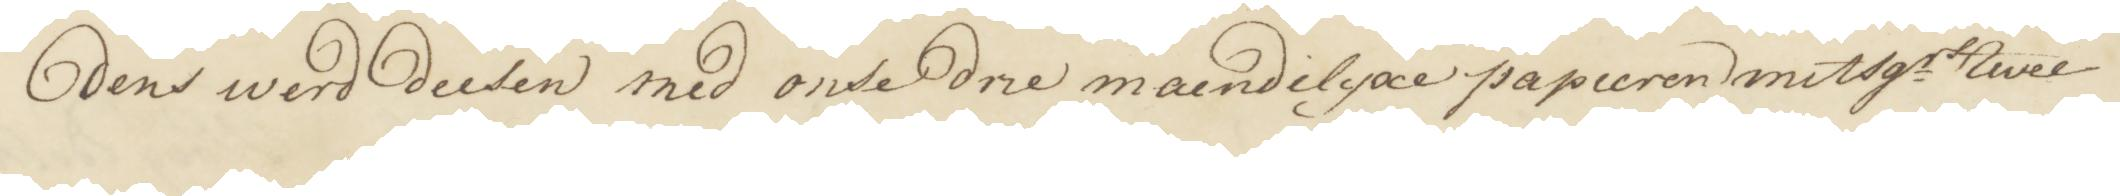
dens werd deesen med onse drie maendelyxe papieren mitsg=rs twee
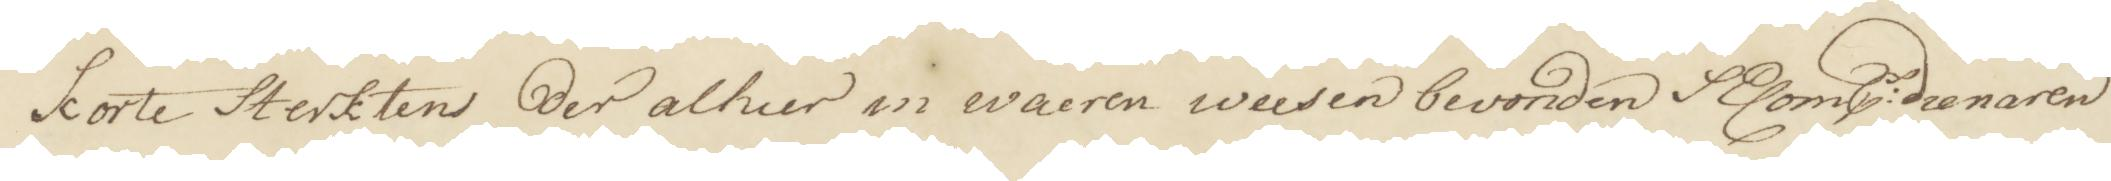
korte sterkten der alhier in waeren weesen bevonden sEComp:s dienaren
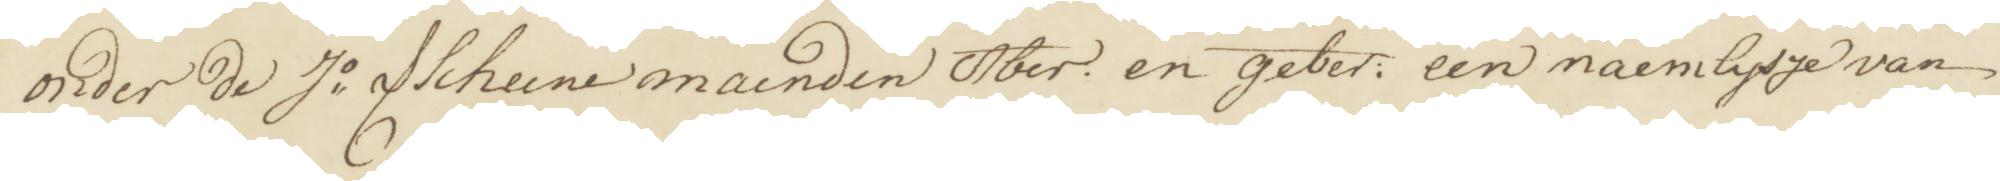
onder de J„o verscheene maenden 8ber: en geber: een naemlysje van
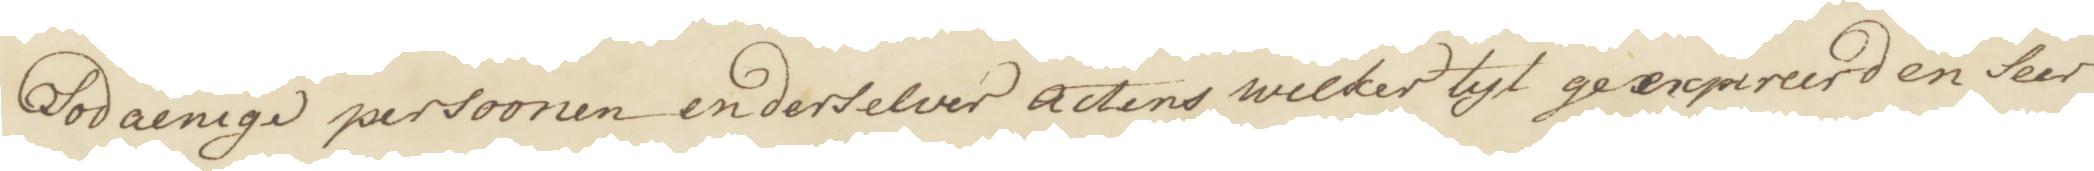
sodaenige persoonen en derselver actens welker tijt geexpireerd en seer
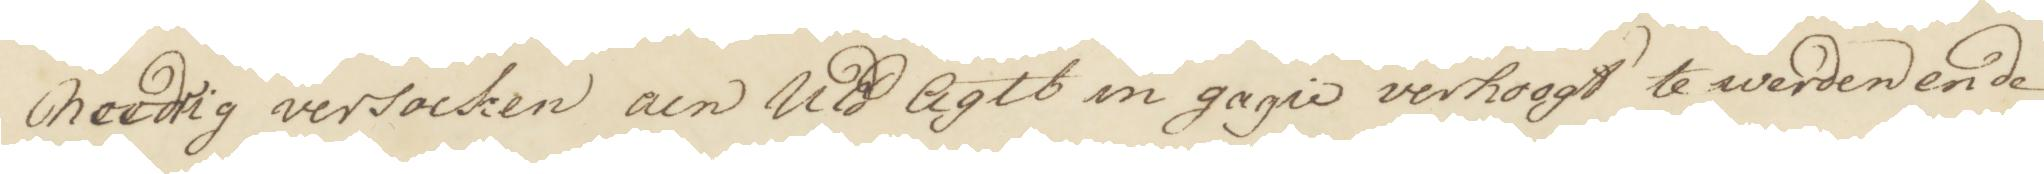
needrig versoeken aen uEd Agtb in gagie verhoogt te werden en de
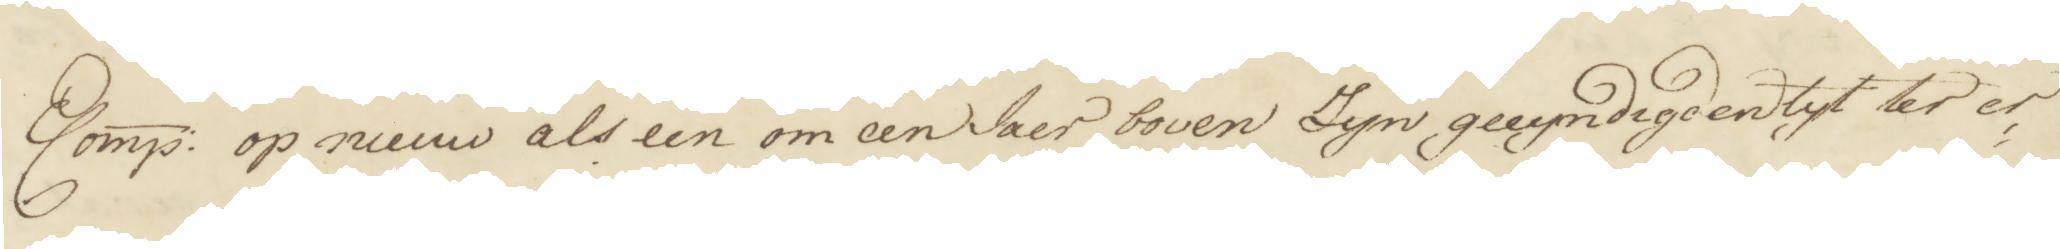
EComp: op nieuw als een om een iaer boven zijn geeyndigden tyt ter er„
